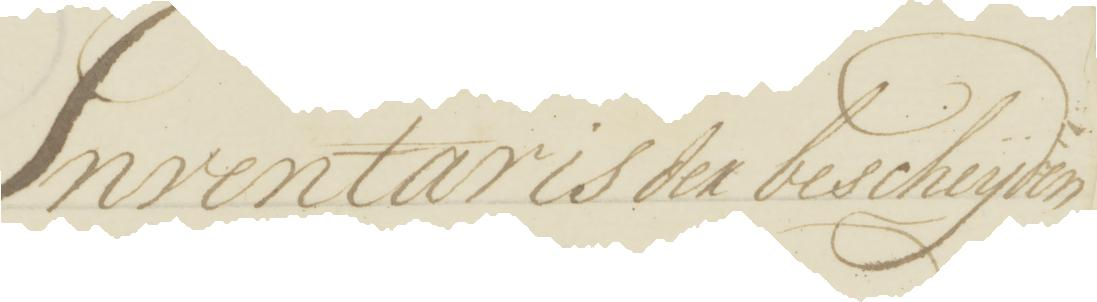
Jnventaris der bescheijden
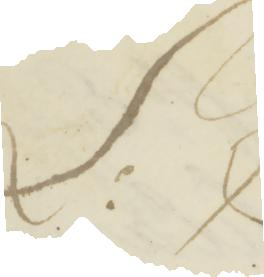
L: S
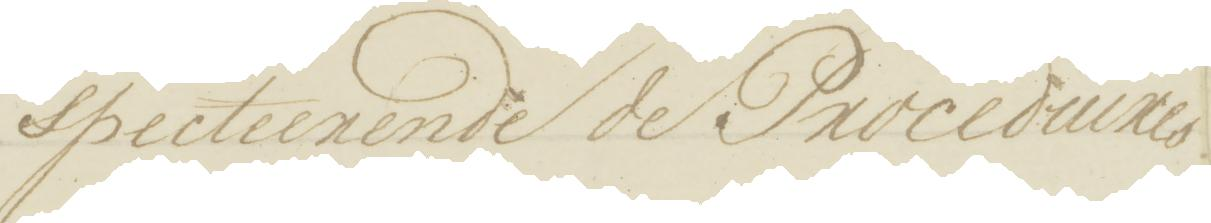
specteerende de Proceduires
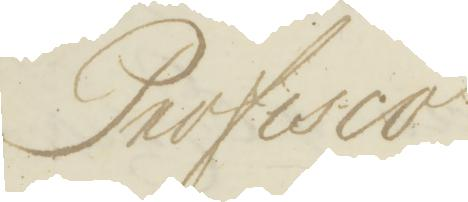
Profisco
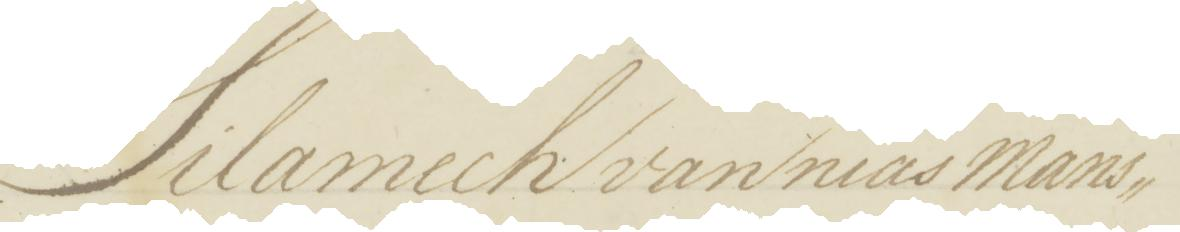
Silamech van nias mans„
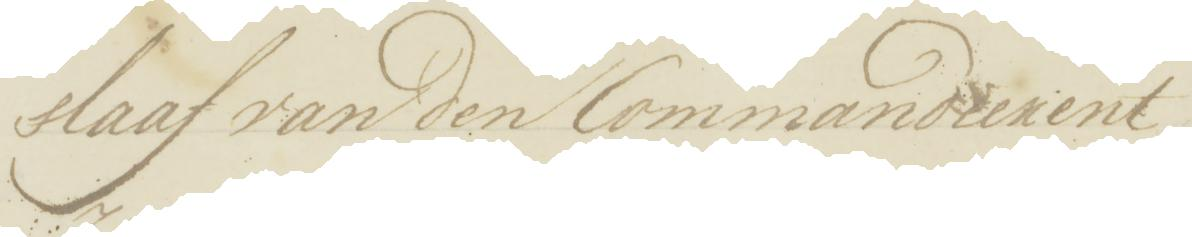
slaaf van den Commandeerent
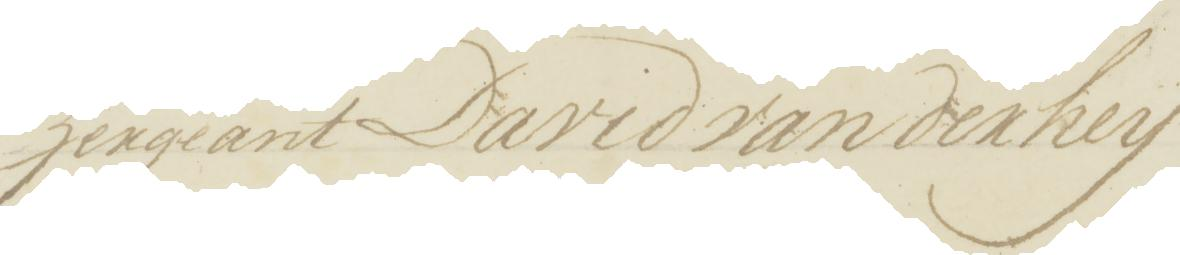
zergeant David van der heij
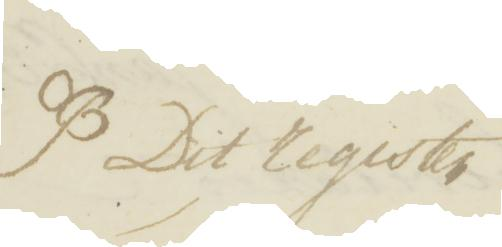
Dit register
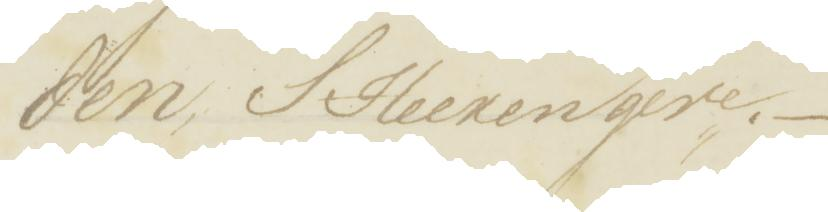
den, s Heeren gev„e.
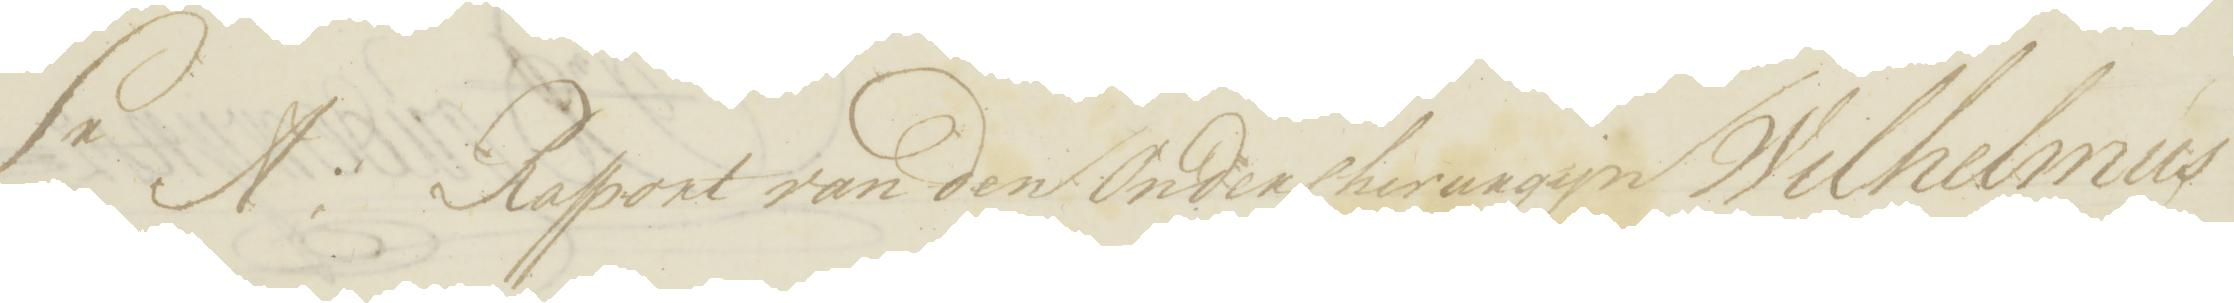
Lr A: Rapport van den onder Chirurgijn Wilhelmus
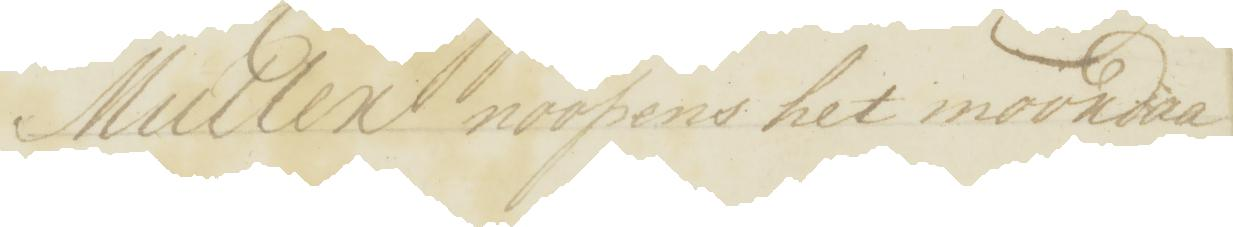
Muller noopens het moordaa
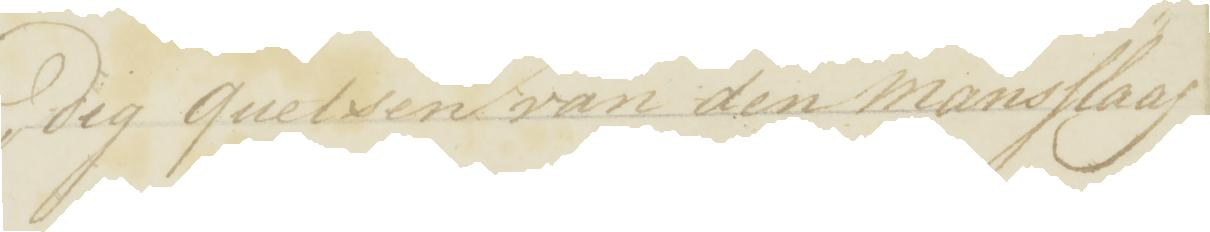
„dig quetsen van den mansslaaf
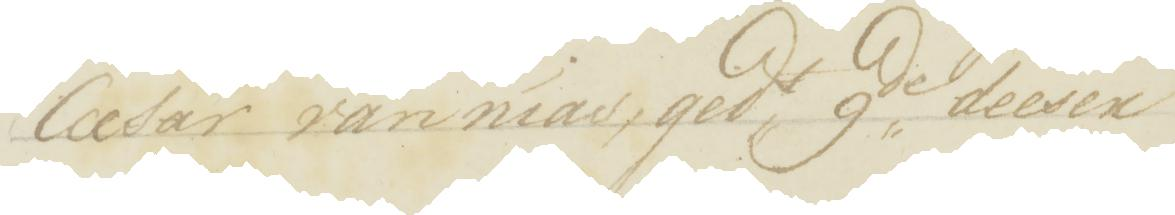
Ceesar van nias, ged„t g„de deeser
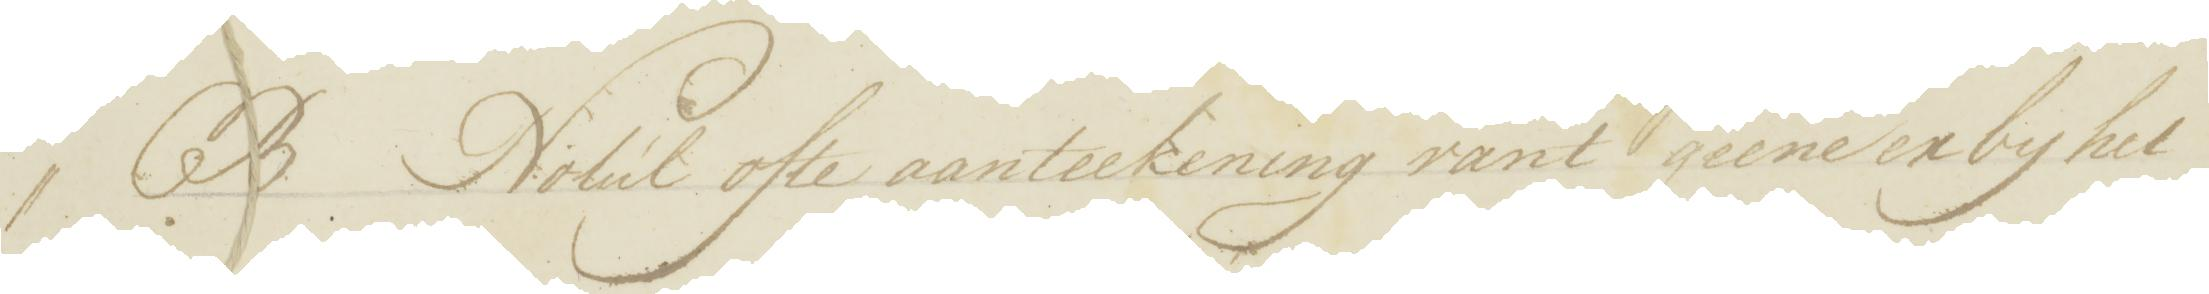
„ B Notul ofte aanteekening van't geene er bij het
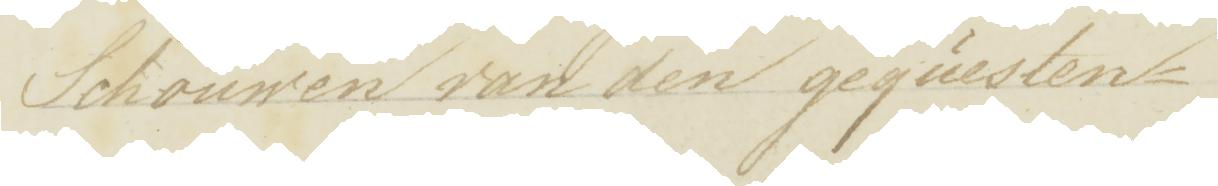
schouwen van den gequesten=
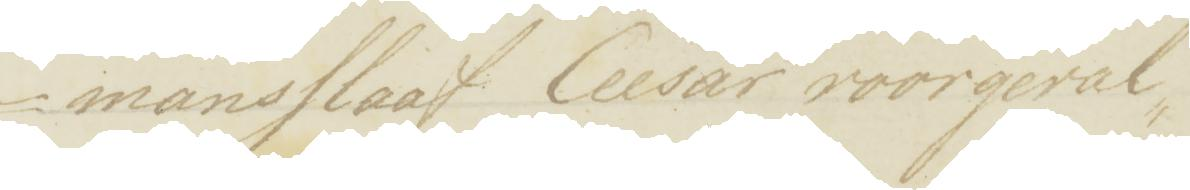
=mansslaaf Ceesar voorgeval„
